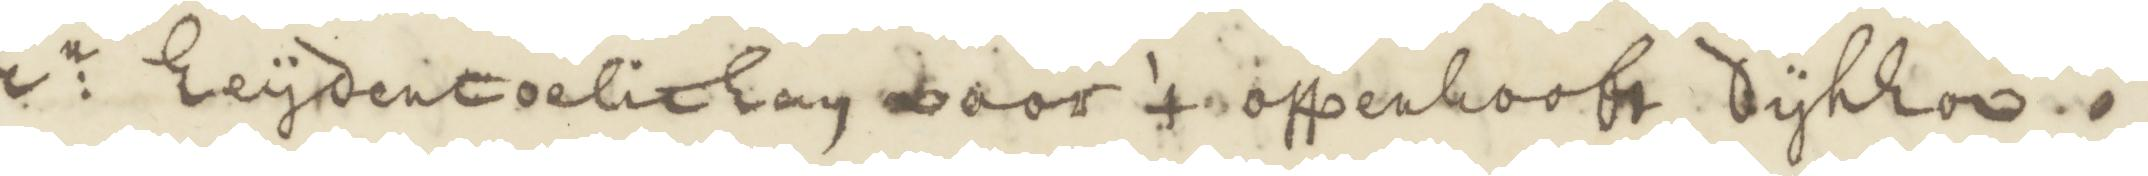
h:r heijdercoelichan voor ’t opperhooft dijkhoe
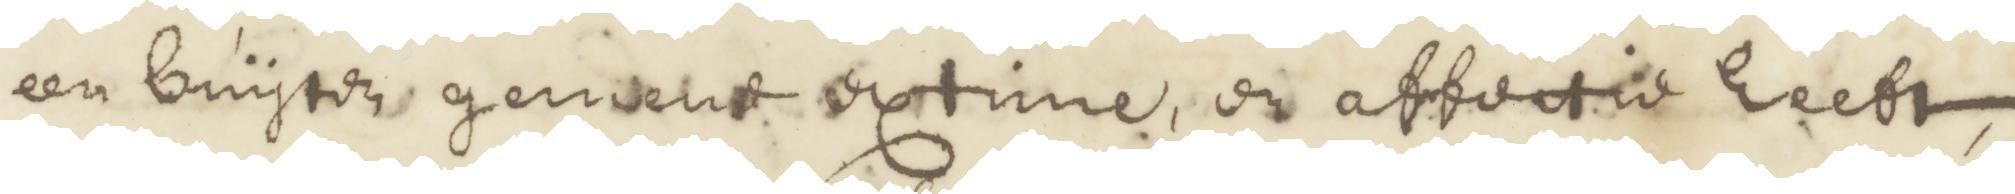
een buijten gemene extime, en affectie heeft,
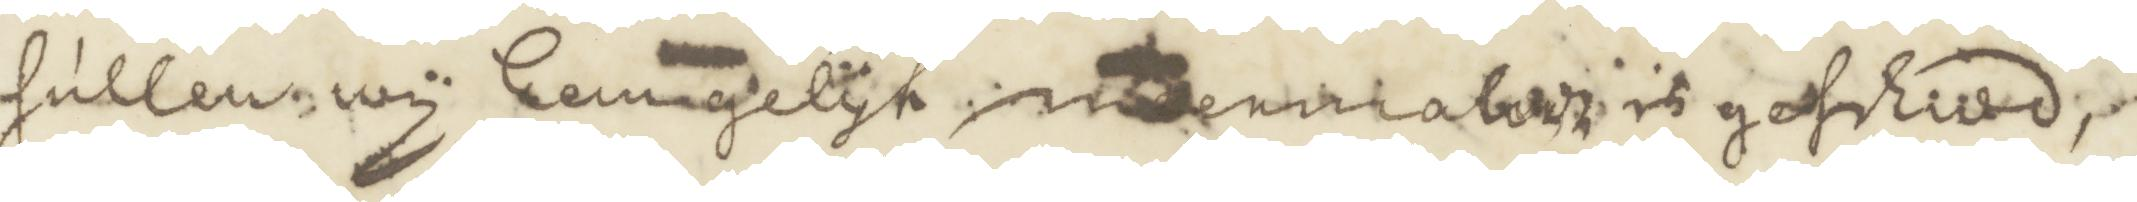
sullen, wij hem gelijk meermalen is geschied,
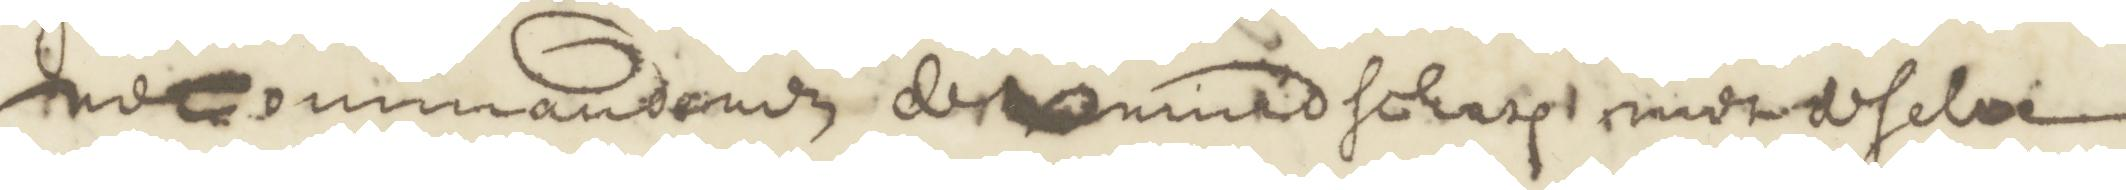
recommanderen dese vrundschap met deselve
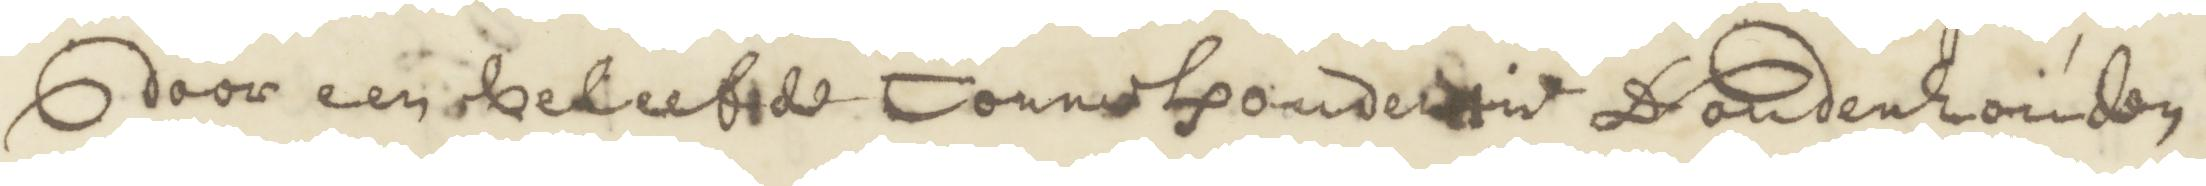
door een beleefde correspondentie te onderhouden
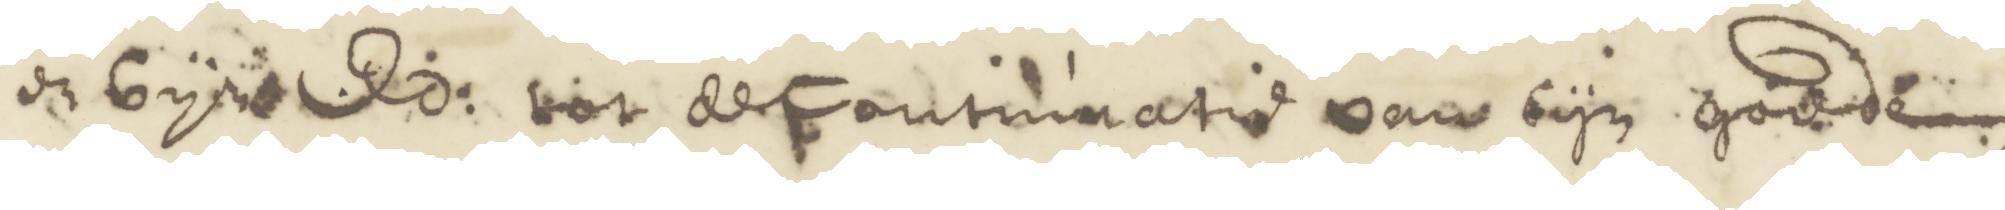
en biju Ed: tot de continuatie van sijn goede
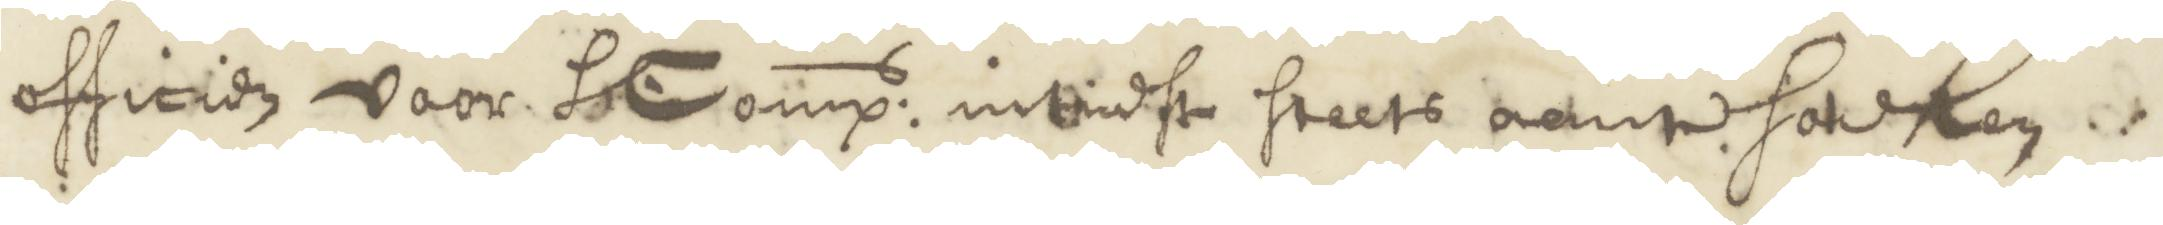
officien voor ’S Comp:s intrest steets aante soeken.
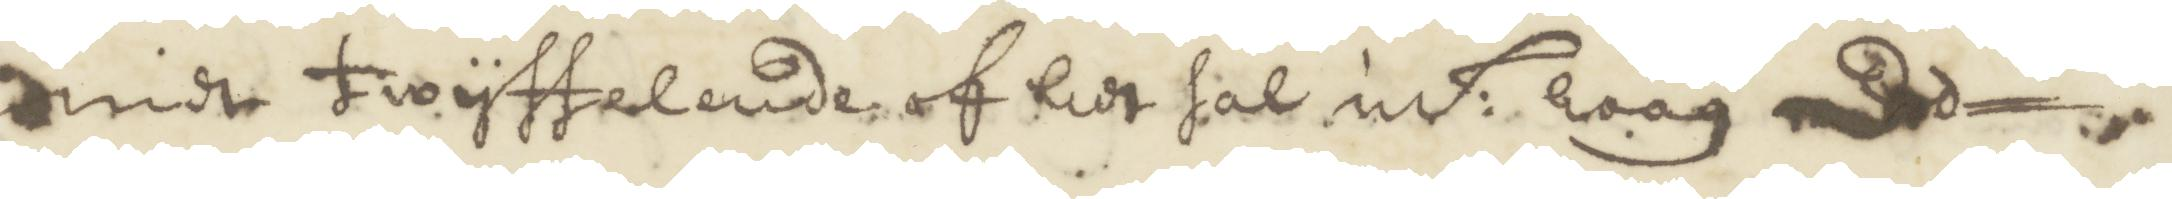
niet twijffelende of het sal uE: hoog Ed=
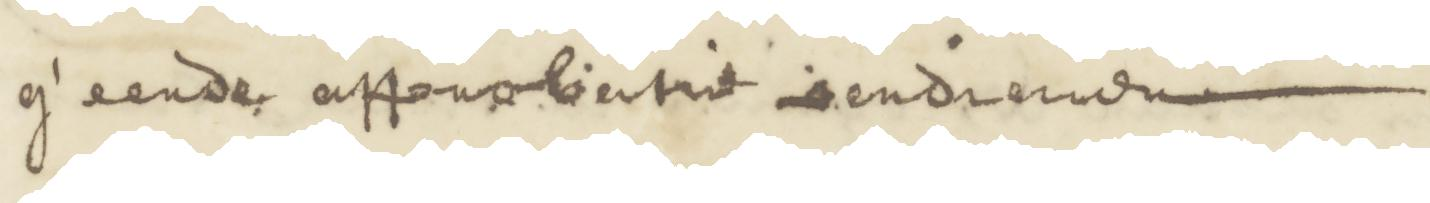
g’eerde approbatie verdienen
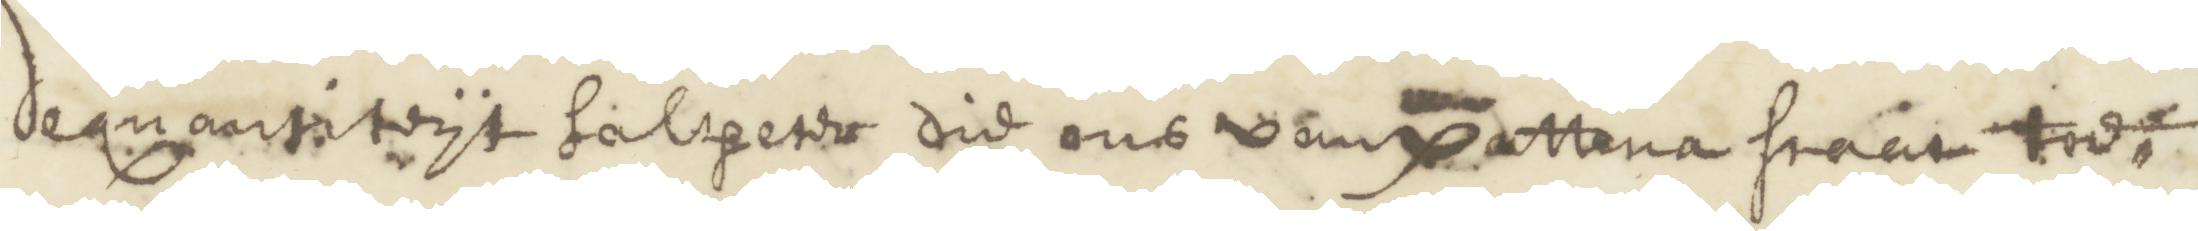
de quantiteijt salpeter die ons van pattena staat toe„
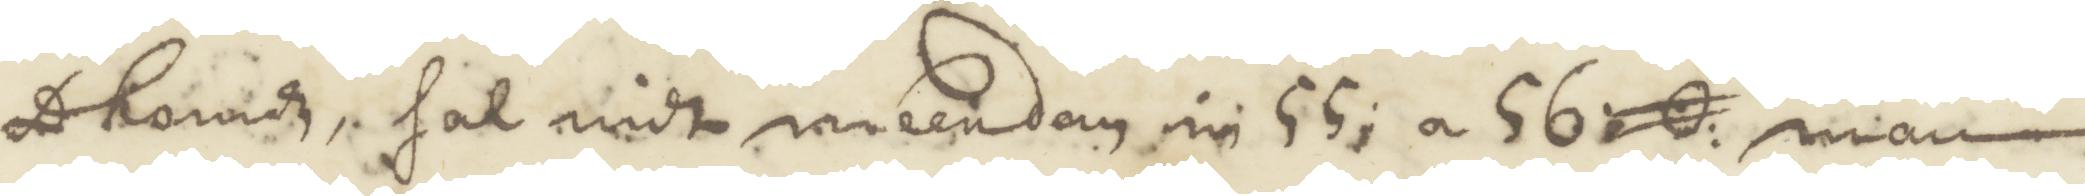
te komen, sal niet meer dan in 55: a 56: Ø man
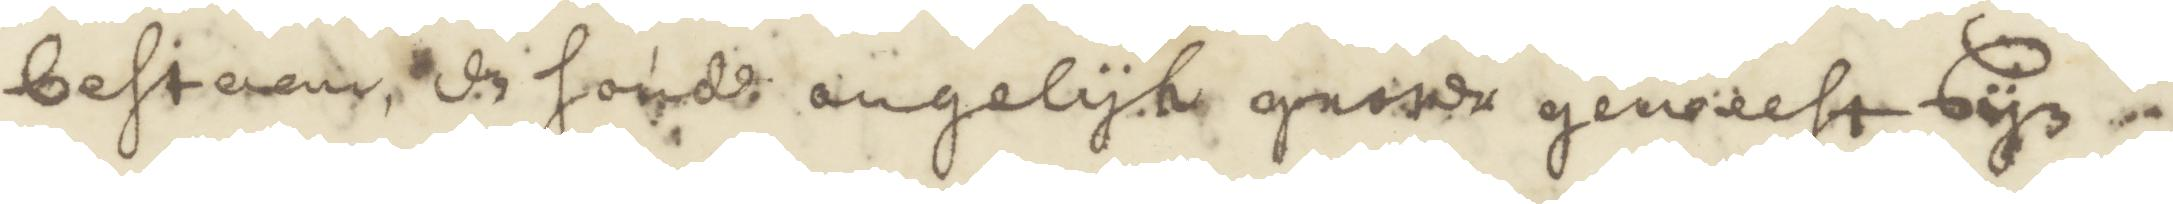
bestaan, ten soude ongelijk groter geweest sijn
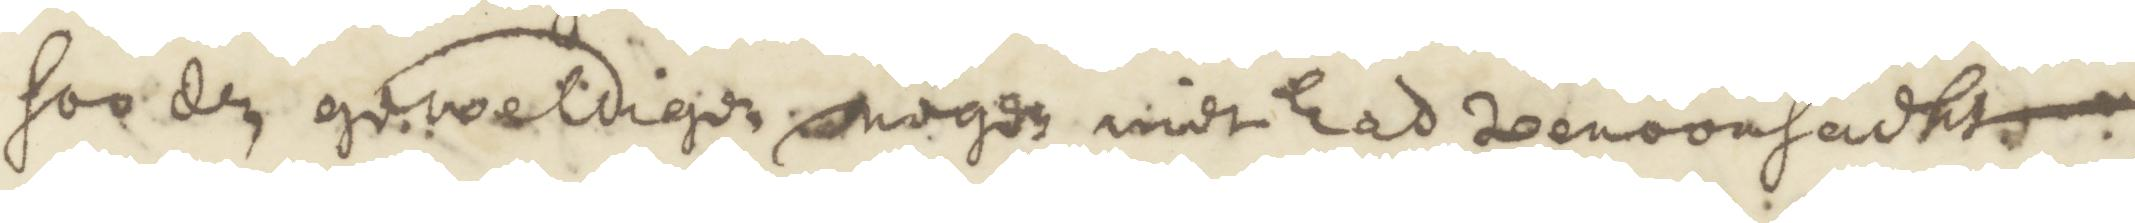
soo den geweldige regen niet had veroorsaekt.
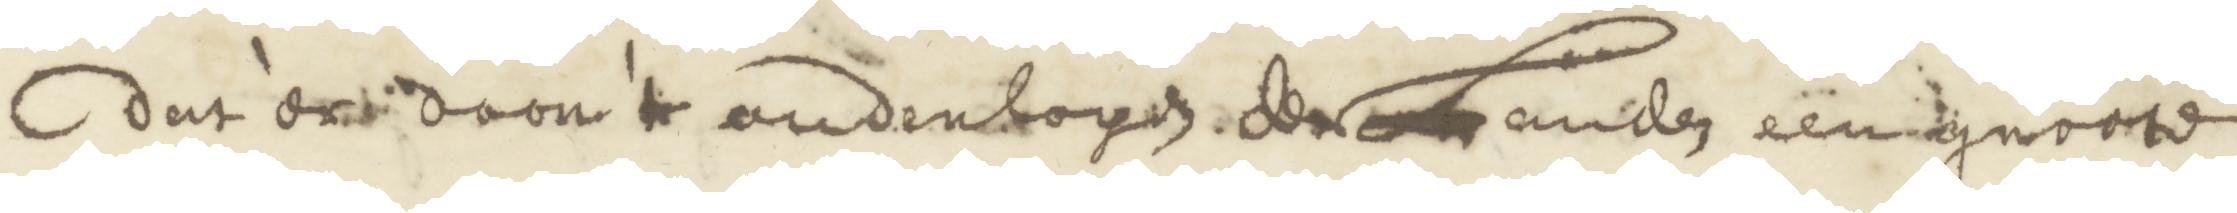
dat er door ’t onderlopen der Landen een groote
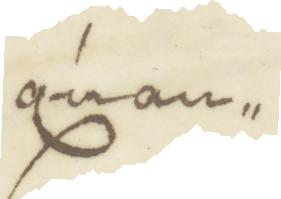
quan„
